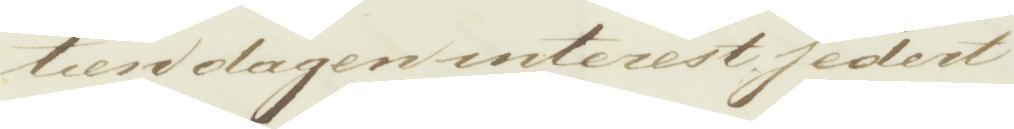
tien dagen interest sedert
